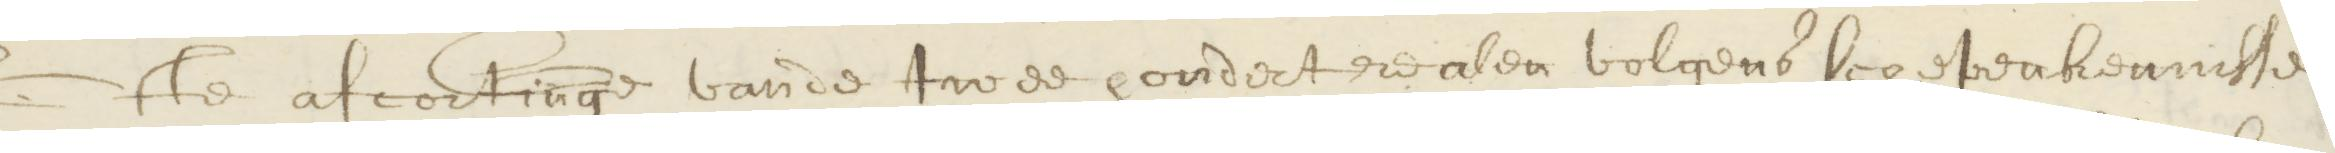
fte afcortinge vande twee hondert realen volgens schepenkennisse
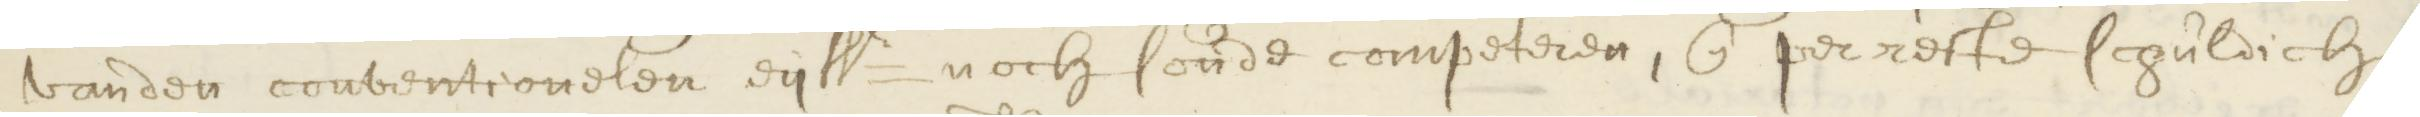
van den conventionelen eijss=r noch soude competeren, ende per reste schuldich
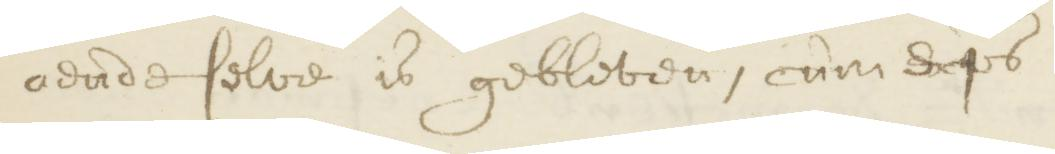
aen deselve is gebleven, cum exps
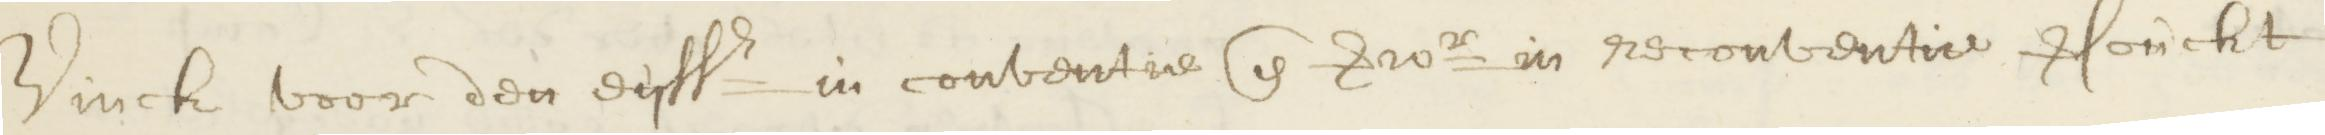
Vinck voor den eijss=r in conventie ende verw=r in reconventie versouckt
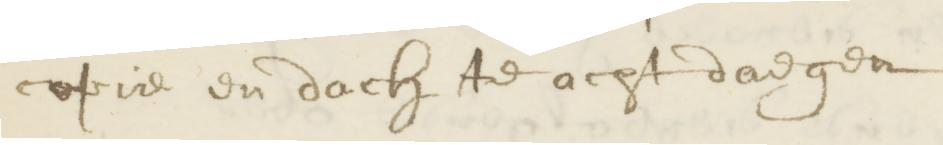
copie en dach te acht daegen
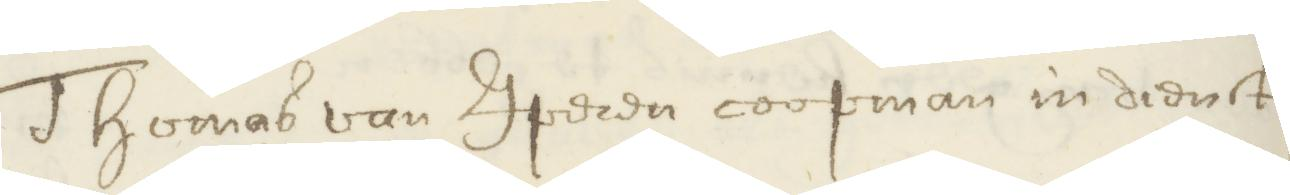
Thomas van Jperen coopman in dienst
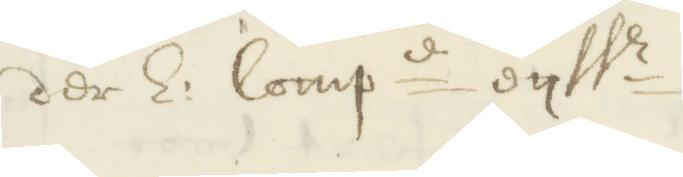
der E: Comp=e eyss=r
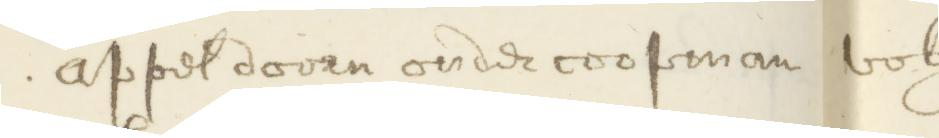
. appeldoorn onder coopman
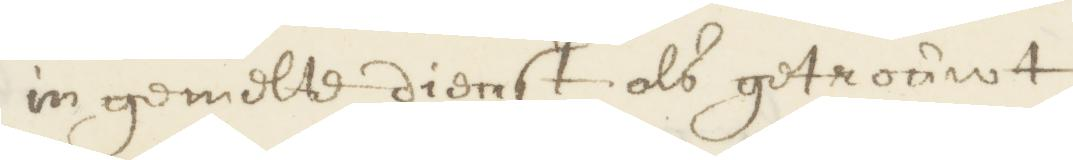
in gemelte dienst als getrouwt
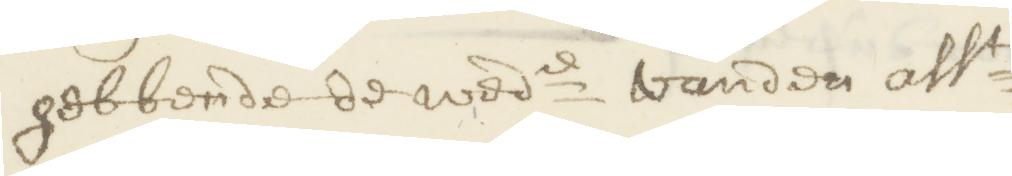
hebbende de wed=e van den ass=t
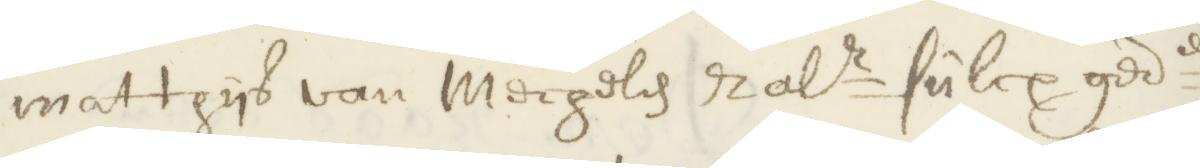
matthijs van Mechelen zal=r sulcx ged=e
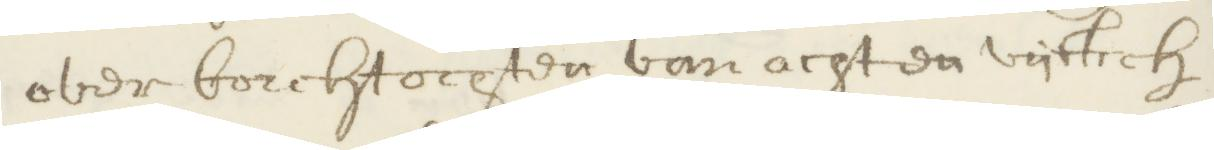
over borchtochten van acht en vijftich
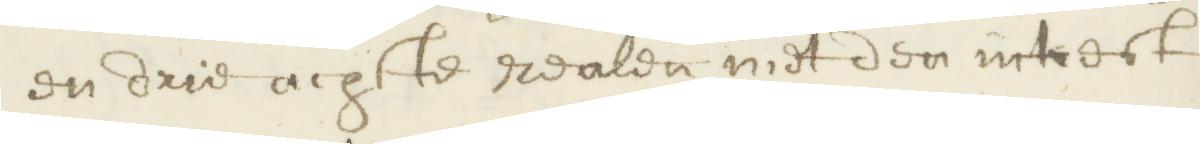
en drie achste realen met den intrest
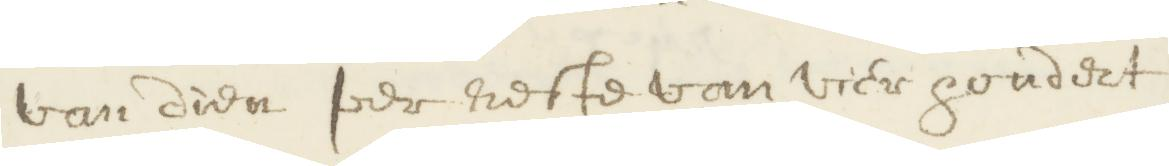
van dien per reste van vier hondert
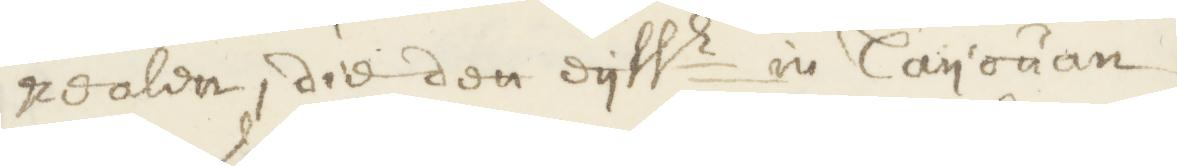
realen, die den eijss=r in Cayouan
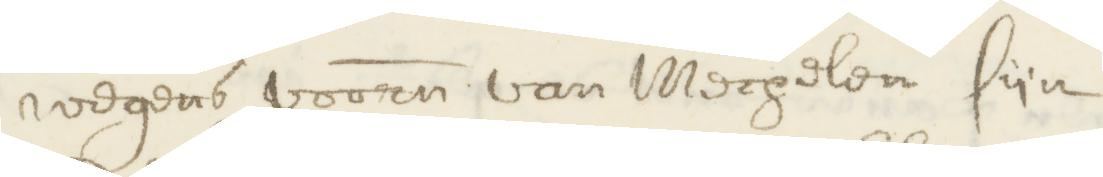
wegens voorn van Mechelen sijn
